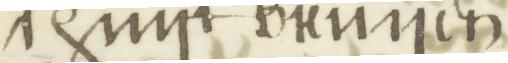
^ huijt bruijen
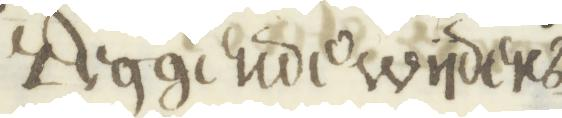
zeggende wijders
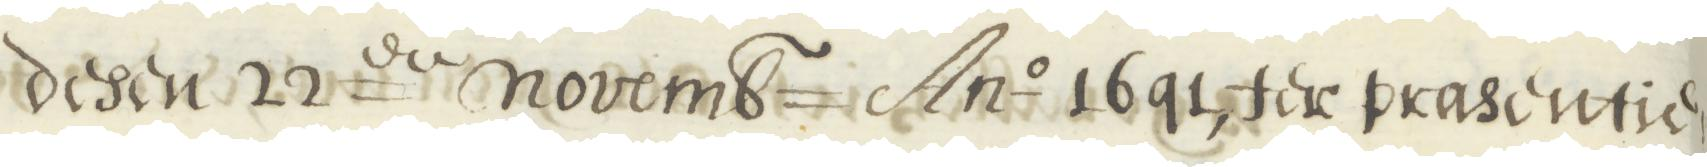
desen 22=en Novemb=r An=o 1641, ter prasentie
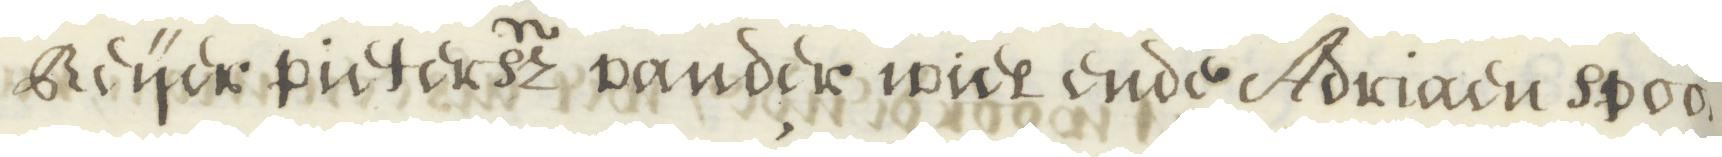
Reijer pietersz van der wiel ende Adriaen spoo
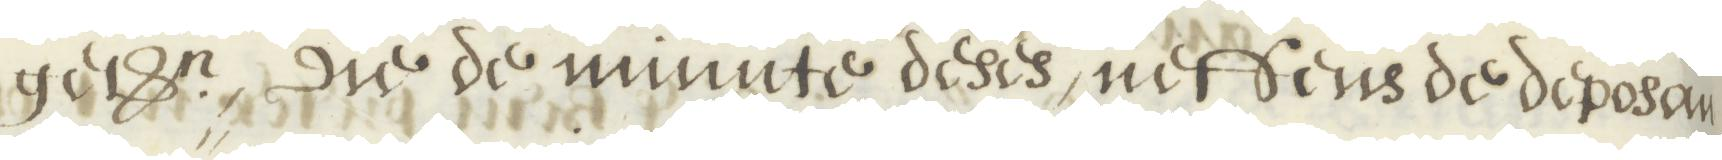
get.n, die de minute deses, neffens de deposan
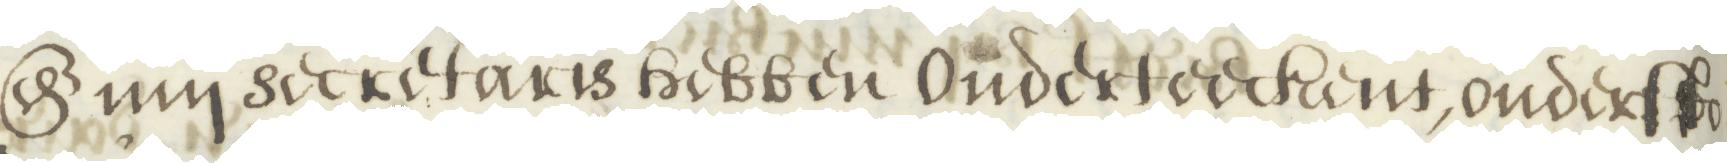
ende mij secretaris hebben Onderteeckent, ondersto
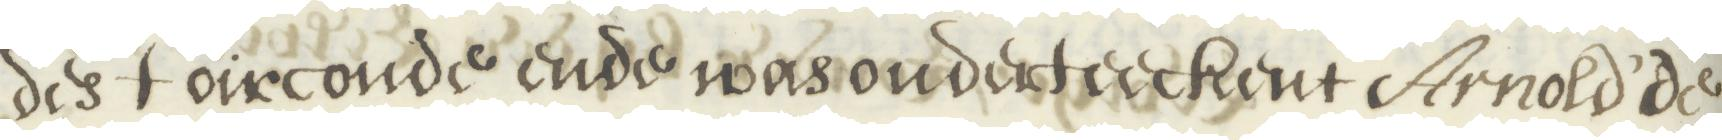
des 't oirconde ende was onderteeckent Arnold' de
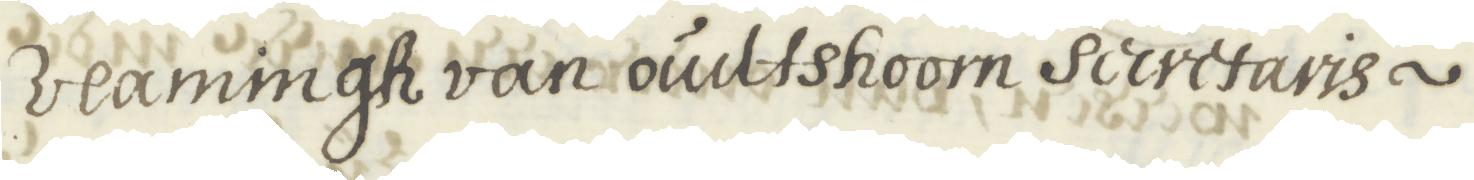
Vlamingh van oudtshoorn Secretaris~
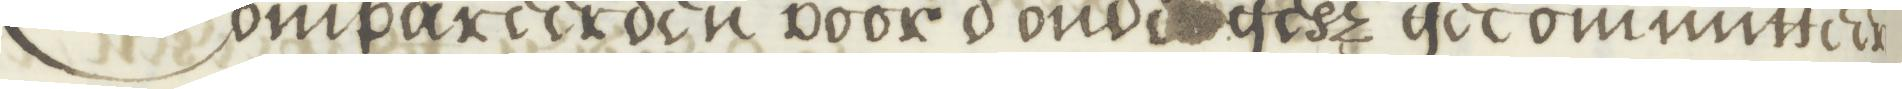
Compareerden voor d’ ondergeszn gecommitteer
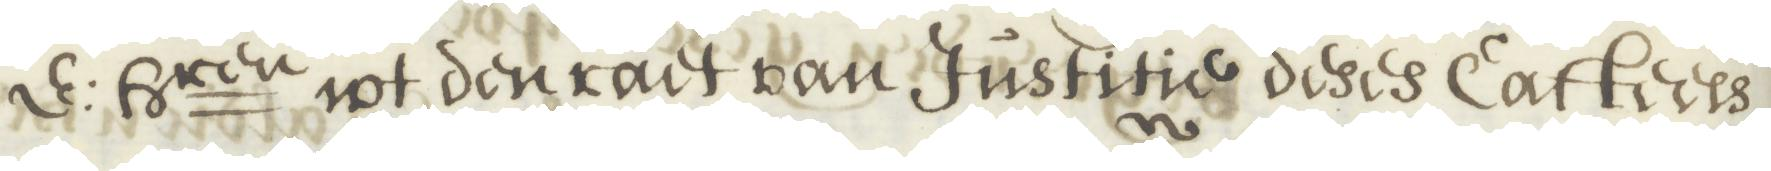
E: H=ren wt den raet van Justitie deses Casteels
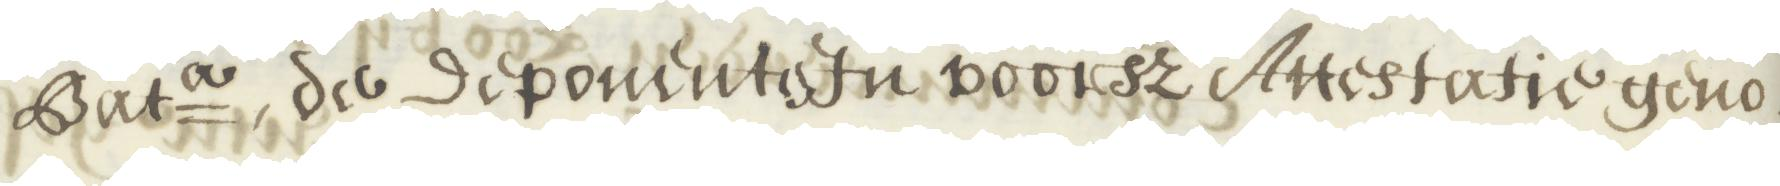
Bat=a, de deponenten voorsz Attestatie geno
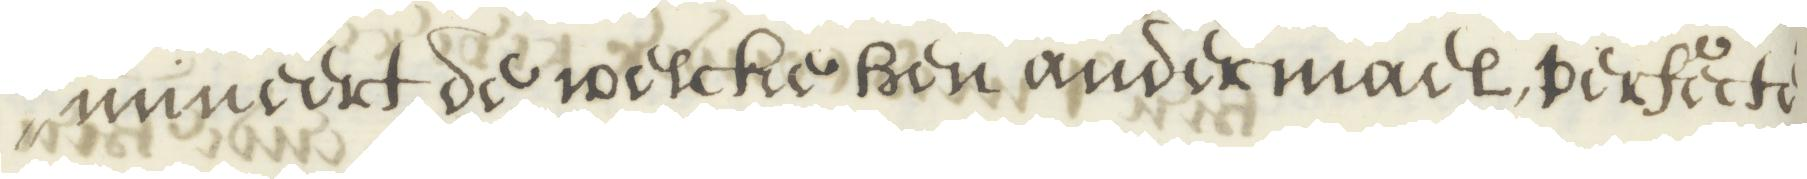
„mineert de welcke hen andermael, perfecte
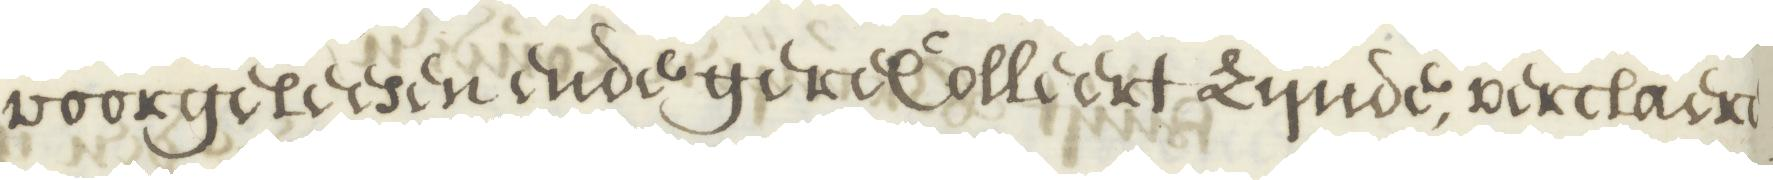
voorgeleesen ende gerecolleert zijnde, verclaert
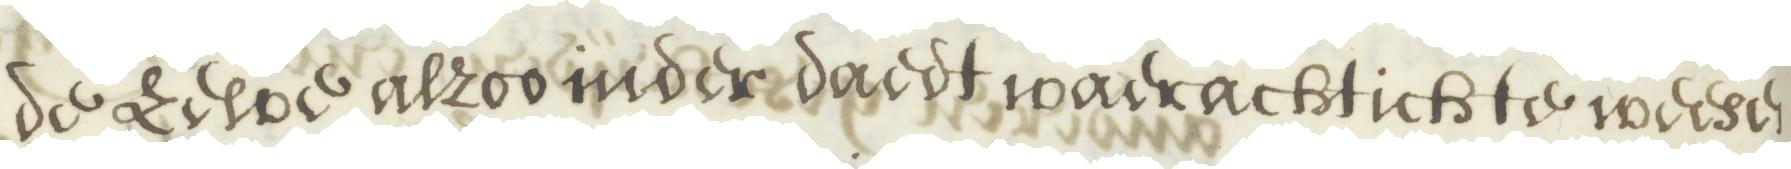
de zelve alzoo inder daedt waerachtich te weese
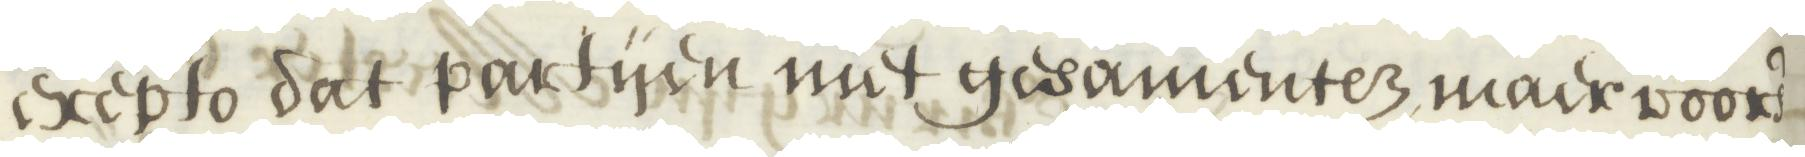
exepto dat partijen niet gesamentlijk maer voor
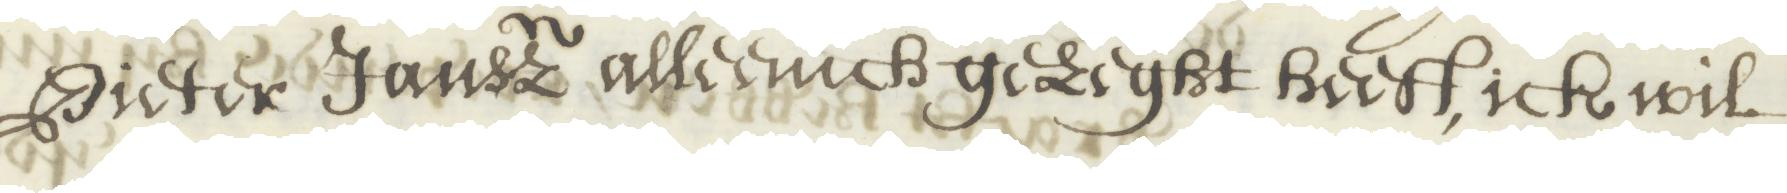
Pieter Jansz alleenich gezeght heeft, ick wil
